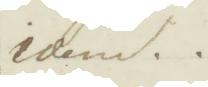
idem. .
